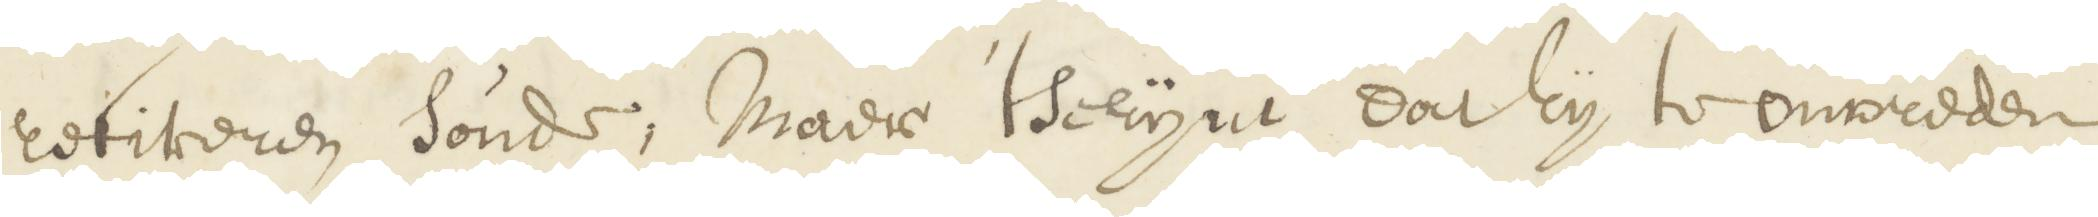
retiteren soude, maer 'tschijnt dat hij te onvreden
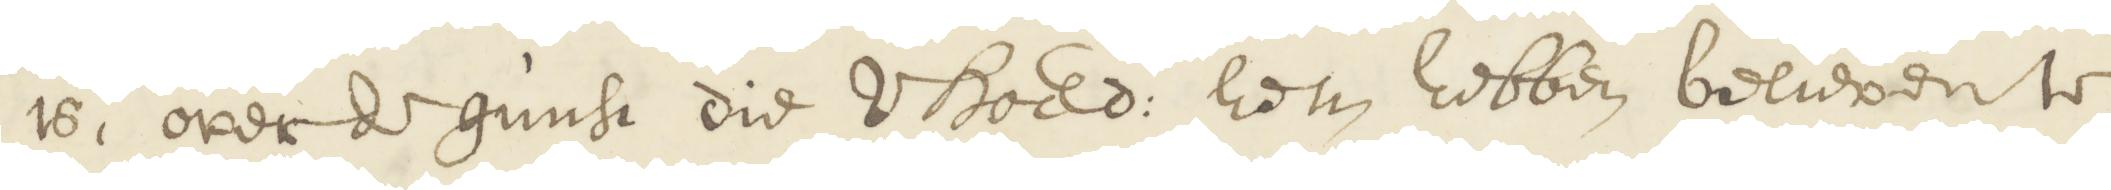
is, over de gunst die VHoEd: hem hebben believen te
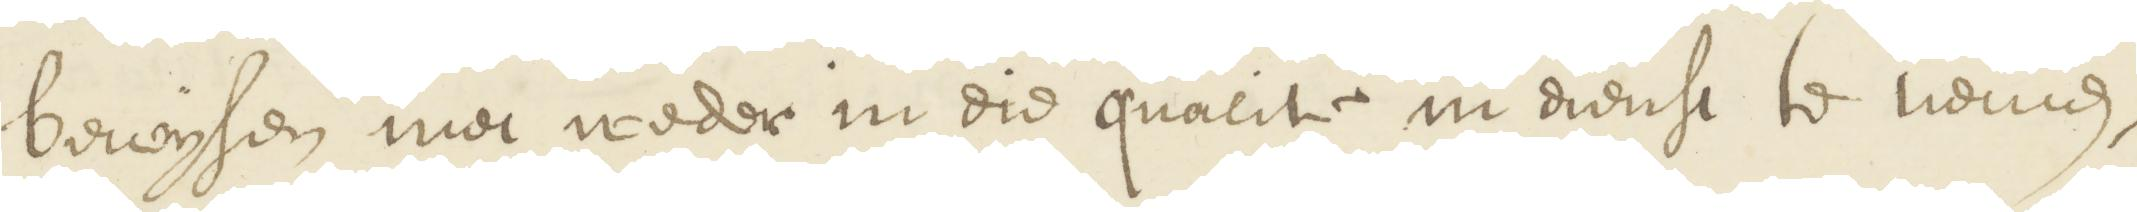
bewijsen met weder in die qualite in dienst te nemen,
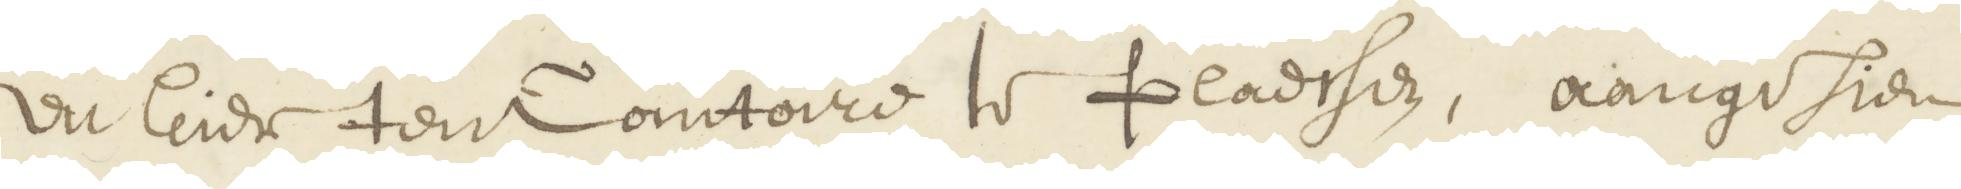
en hier ten Comtoire te plaetsen, aangesien
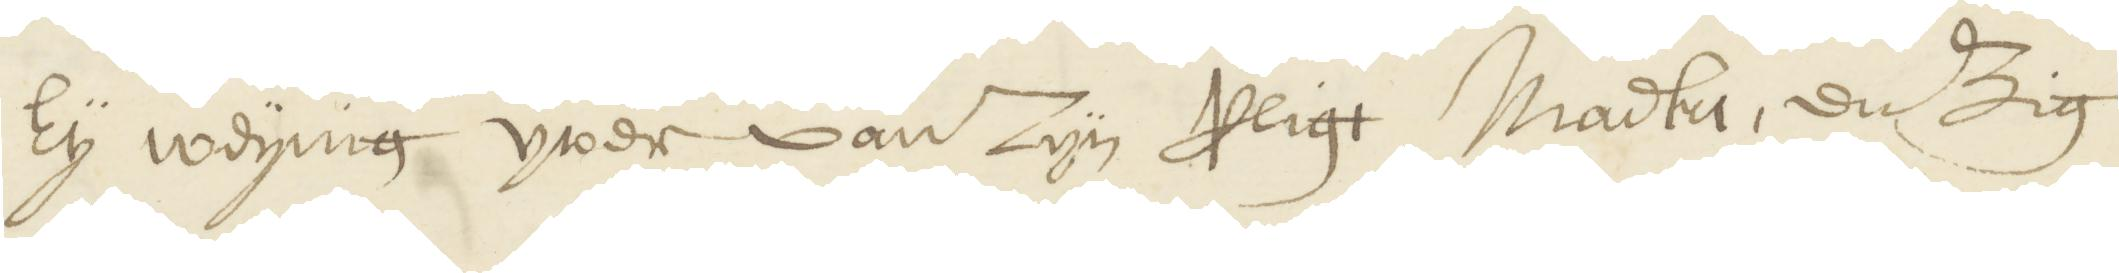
hij weijnig ijver van zijn pligt Maekt, en zig
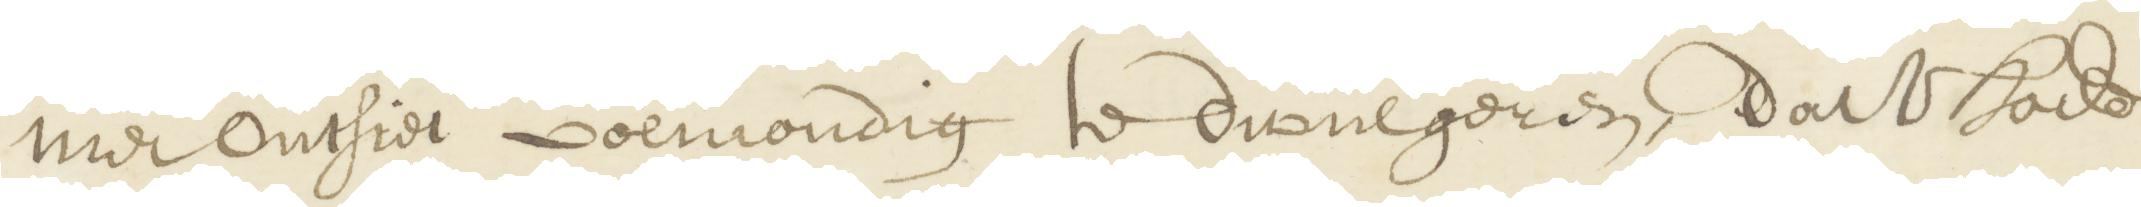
niet ontsiet volmondig te divulgeren, dat VHoEd
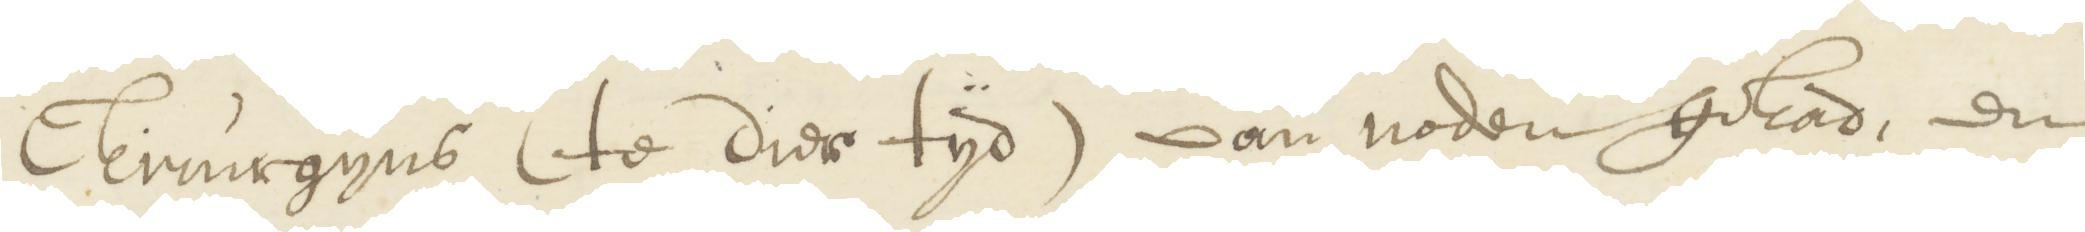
Chirurgijns (te dier tijd) van noden gehad, en
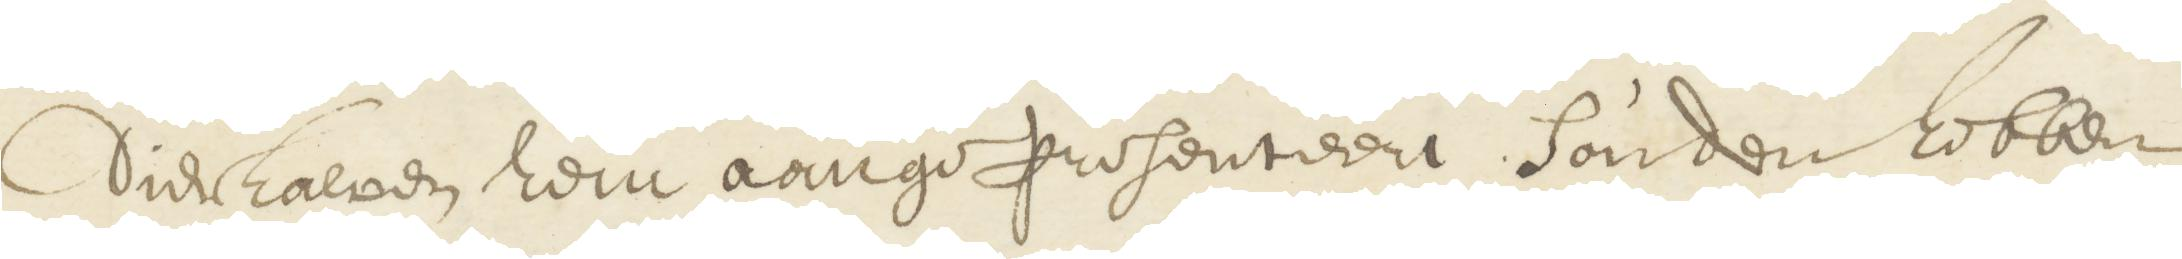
dierhalven hem aangepresenteert souden hebben
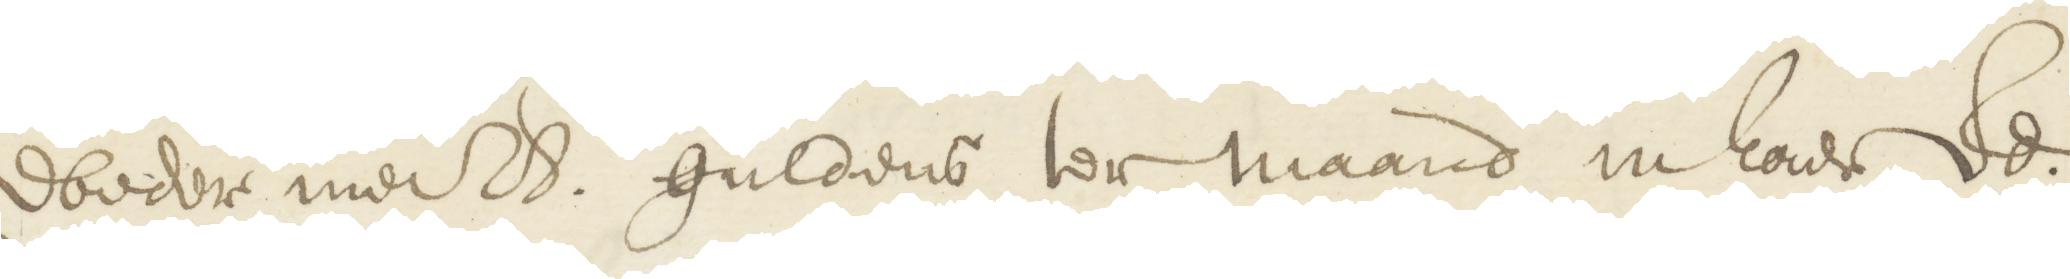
weder met 28. guldens ter maand in haer Ed.
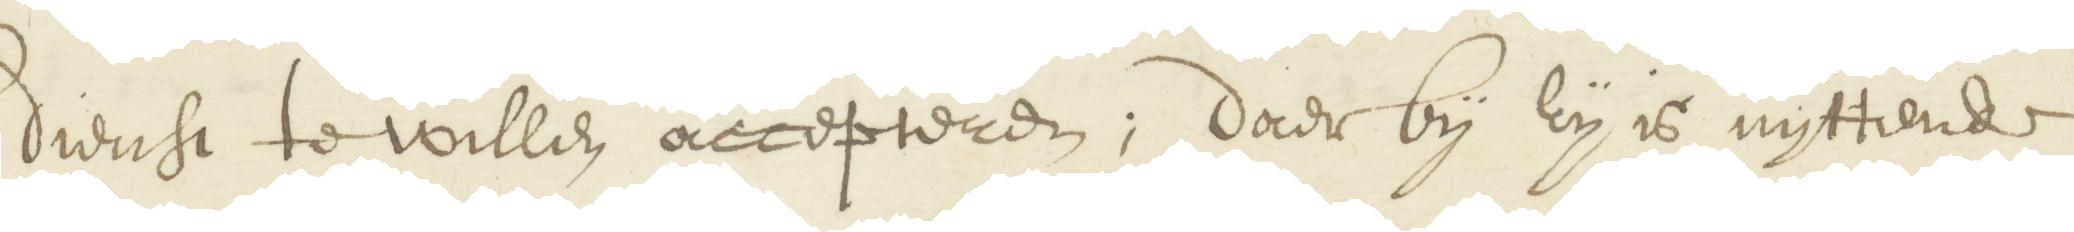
dienst te willen accepteren; daer bij hij is uijttende
